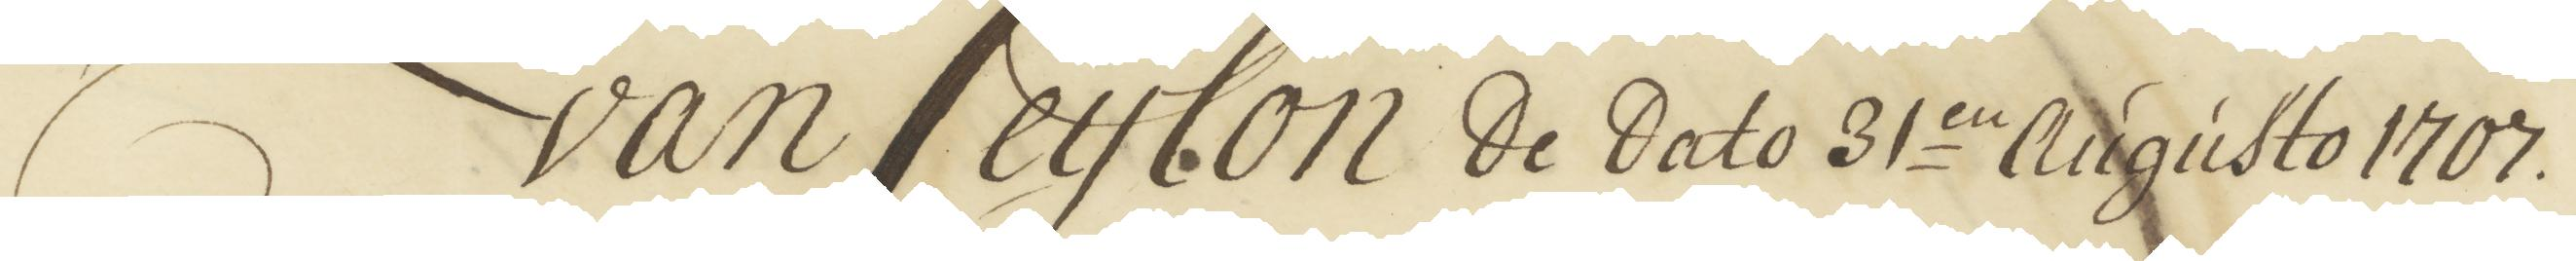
van Ceijlon de dato 31=en Augusto 1707.
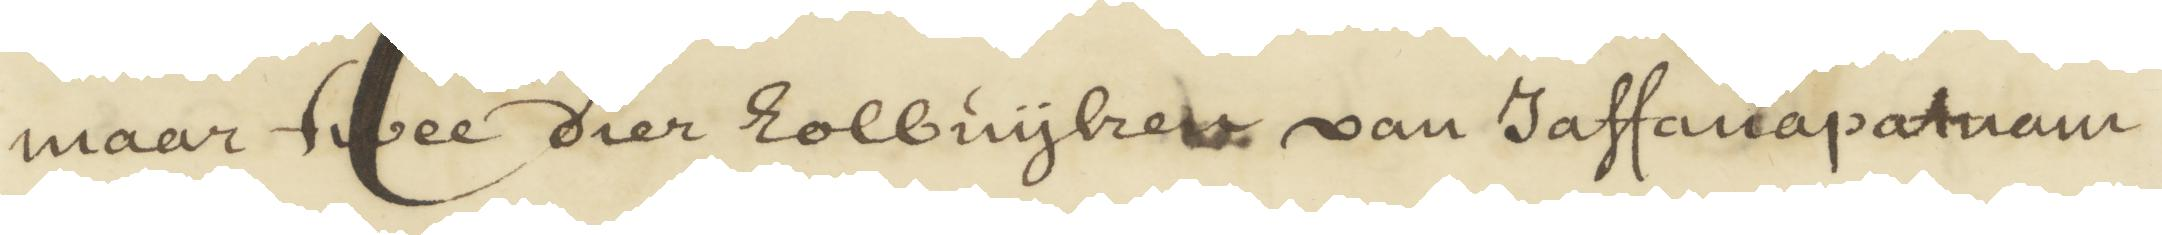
maar twee dier holbuijken van Iaffanapatnam
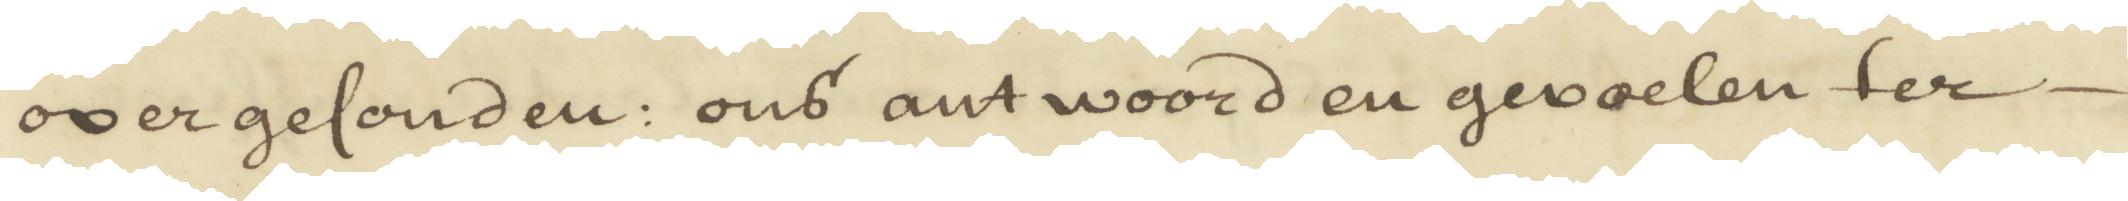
over gesonden: ons antwoord en gevoelen ter
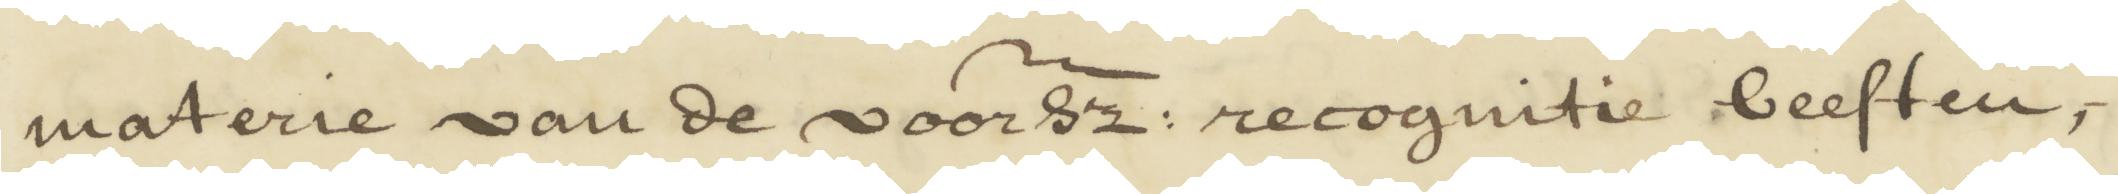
materie van de voorsz: recognitie beesten,
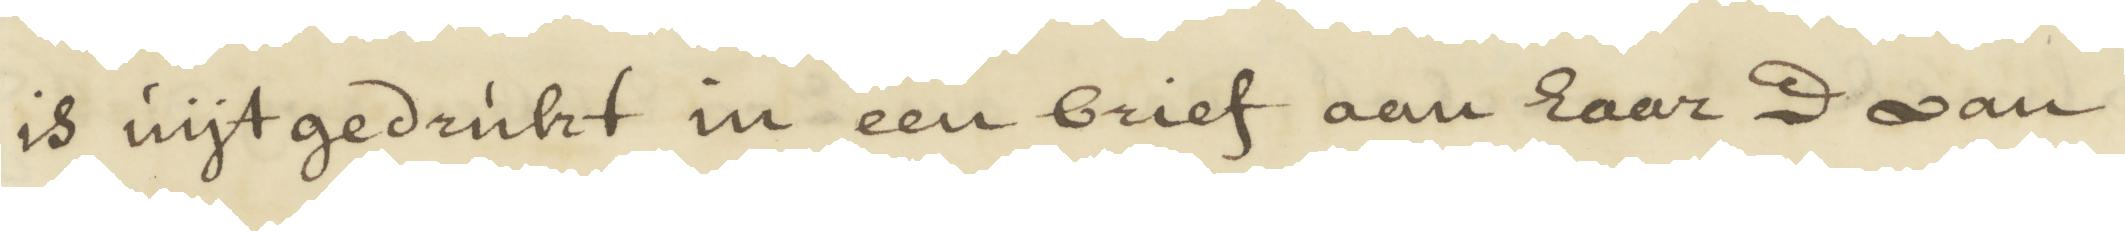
is uijt gedrukt in een brief aan haar E van
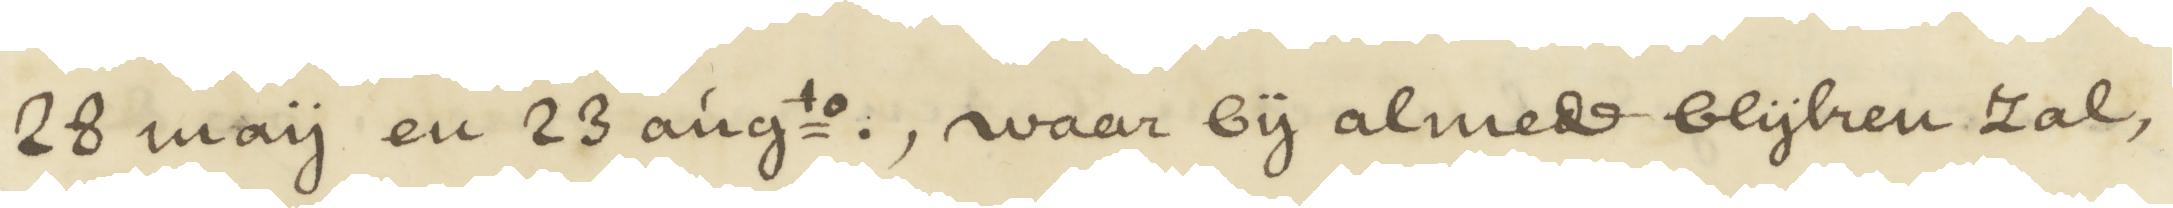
28 maij en 23 aug=to., waar bij almede blijken zal,
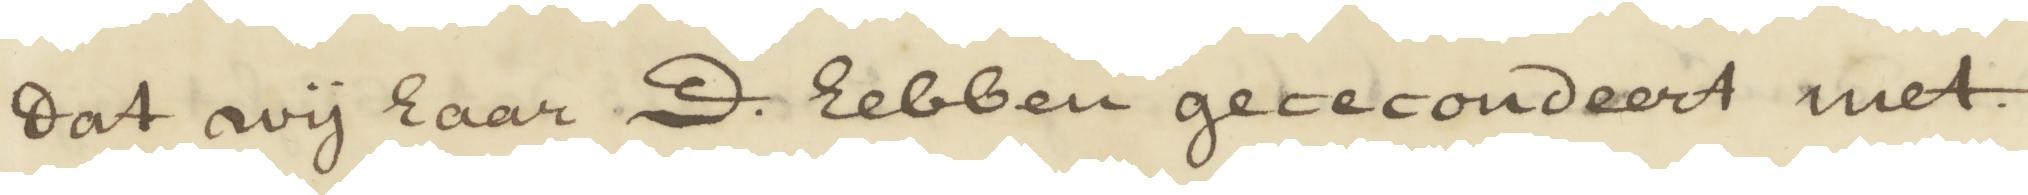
dat wij haar E. hebben gececondeert met.
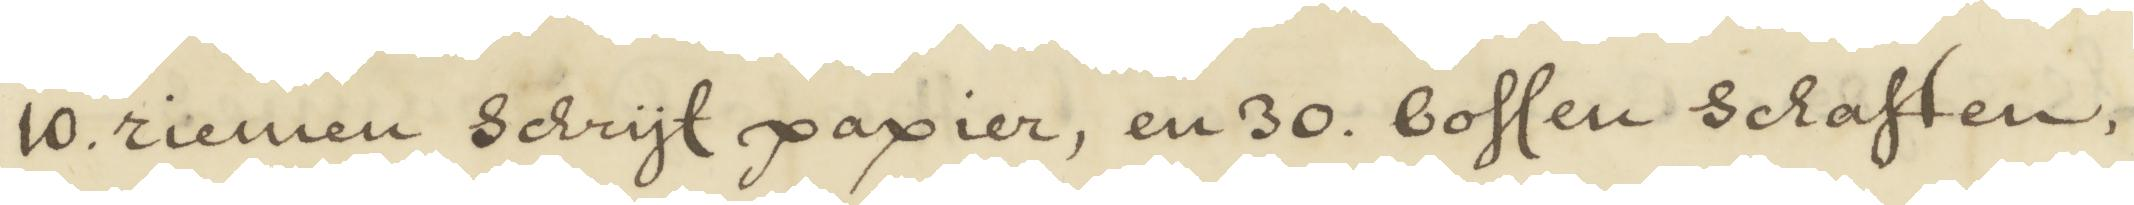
10. riemen schrijf papier, en 30. bossen schaften,
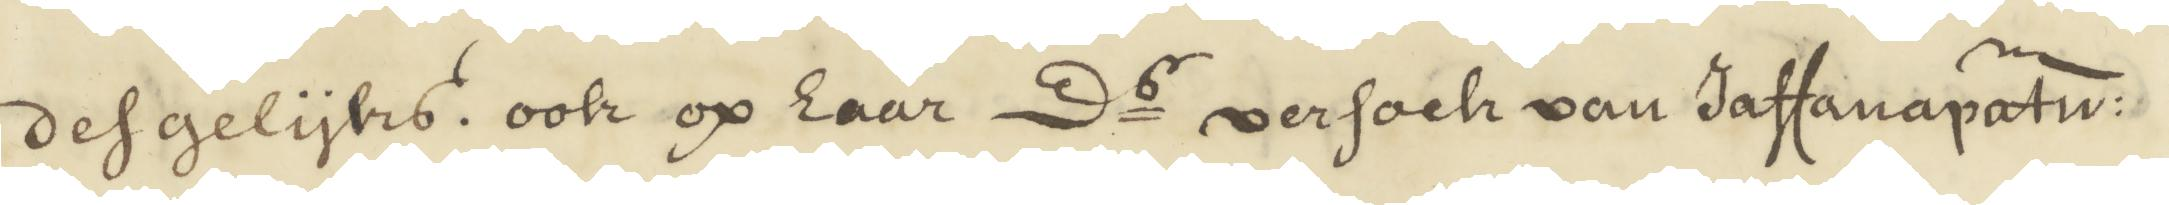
des gelijks. ook op haar E=s versoek van Iaffanapatn:m
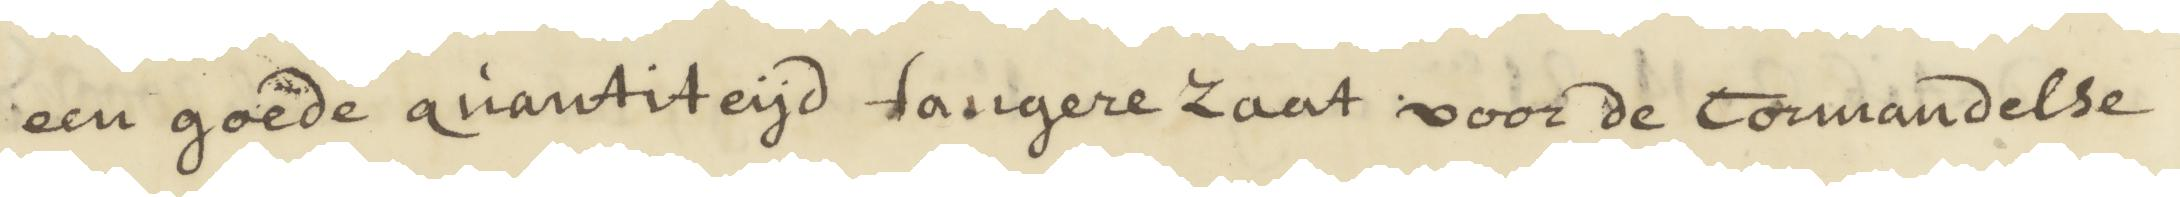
een goede quantiteijd tangere zaat voor de cormandelse
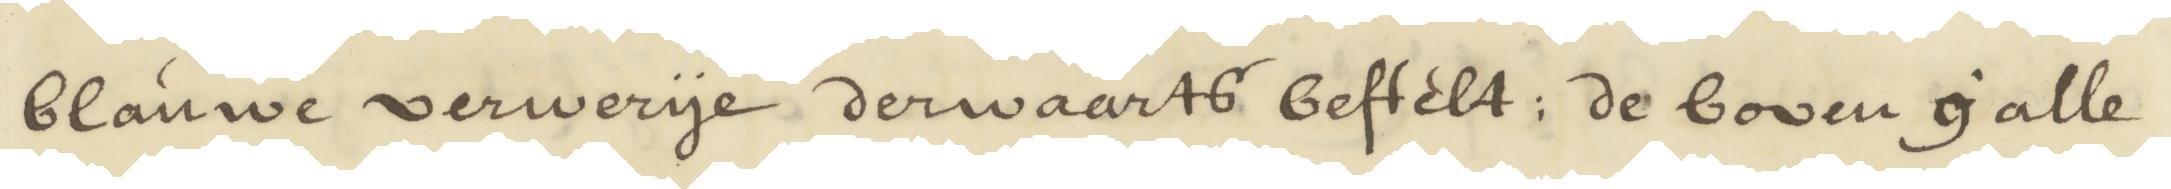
blauwe verwerije derwaarts bestelt: de boven g’alle
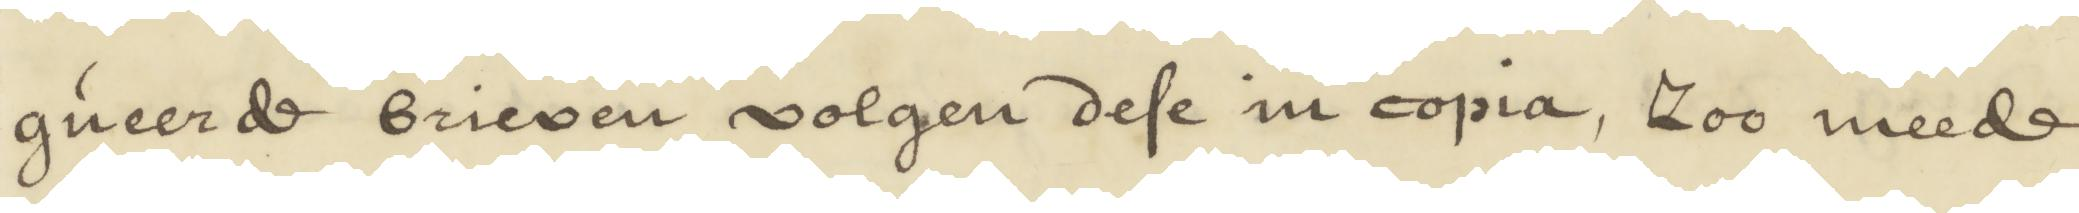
gueerde brieven volgen dese in copia, zoo meede
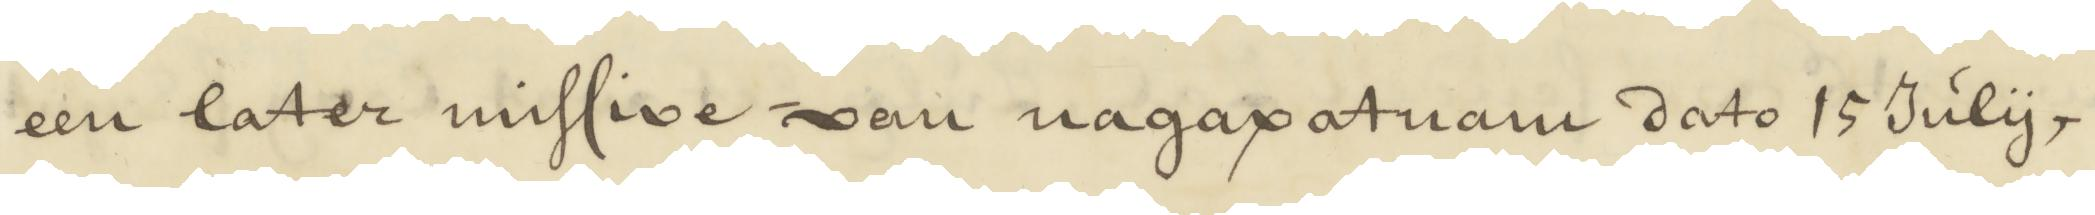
een later missive van nagapatnam dato 15 Iulij,
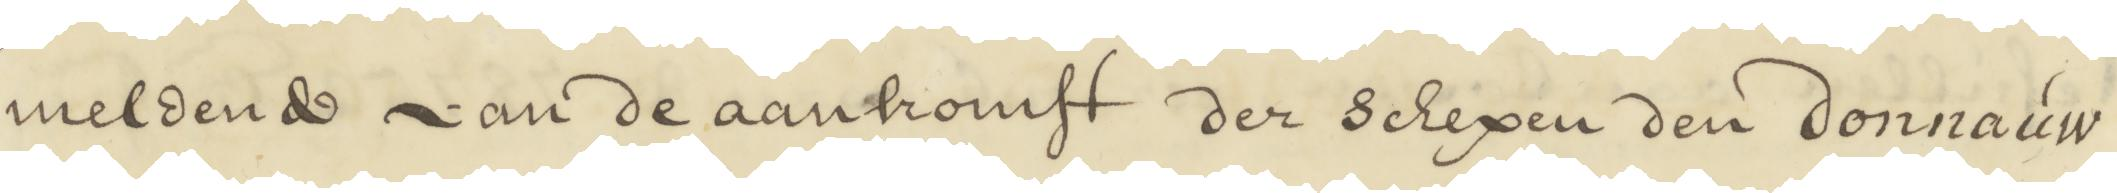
meldende van de aankomst der schepen den donnauw
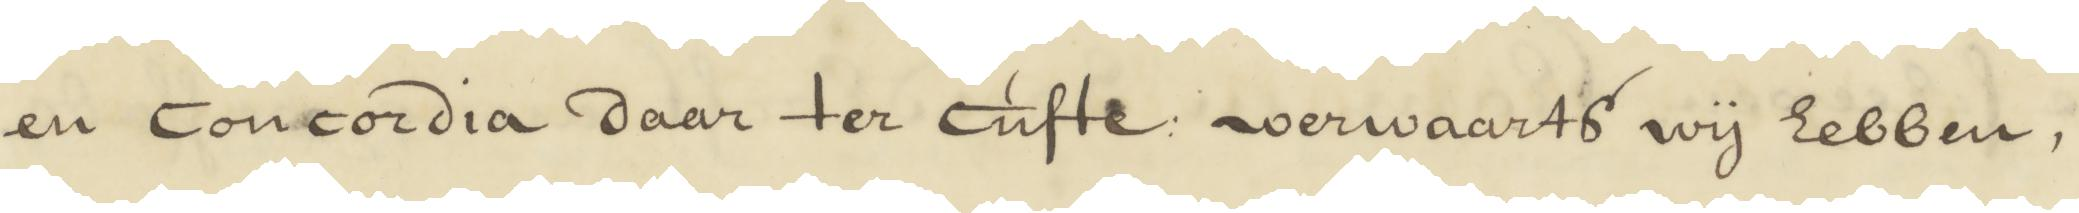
en concordia daar ter custe: werwaarts wij hebben,
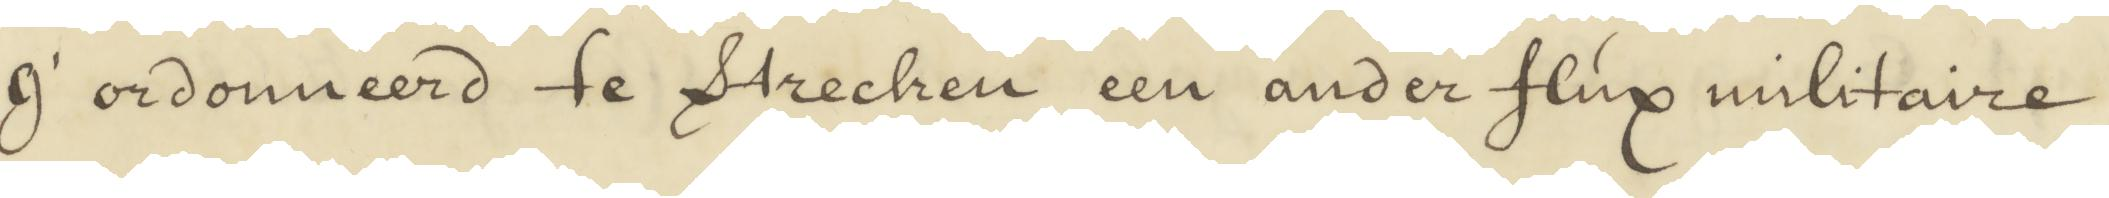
ordonneerd te vertrecken een ander flux militaire
